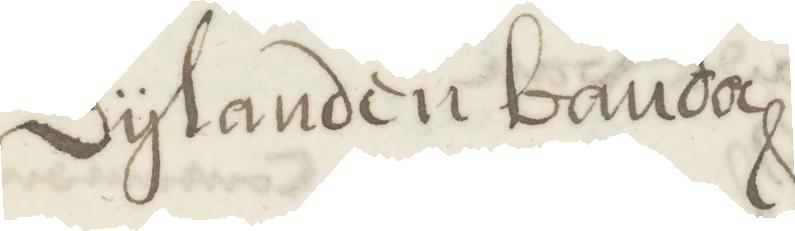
Eijlanden banda
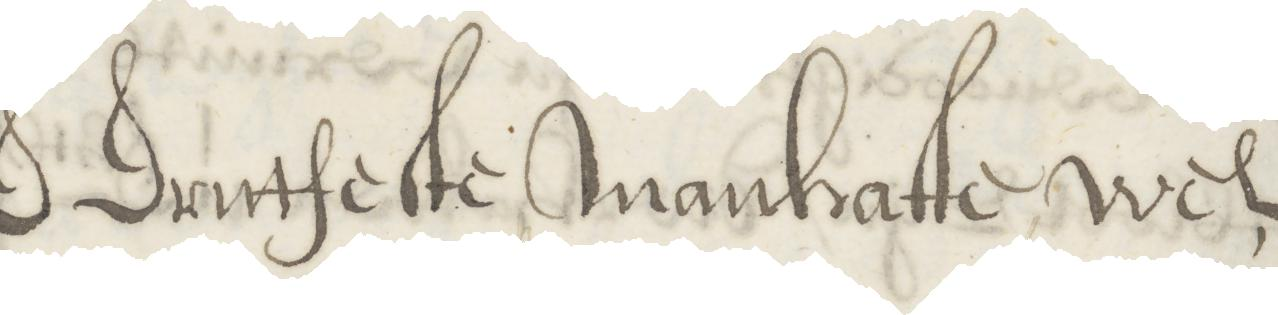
E Erntfeste Manhatte wel
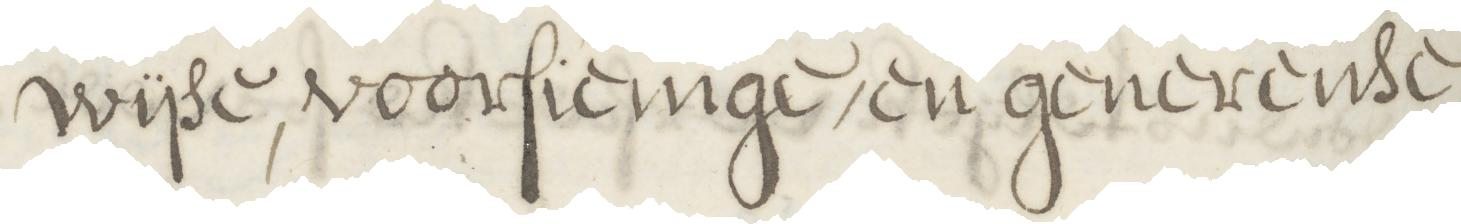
wijse, voorsienige, en genereuse
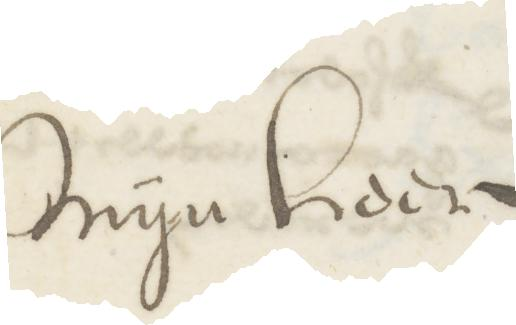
mijn heer
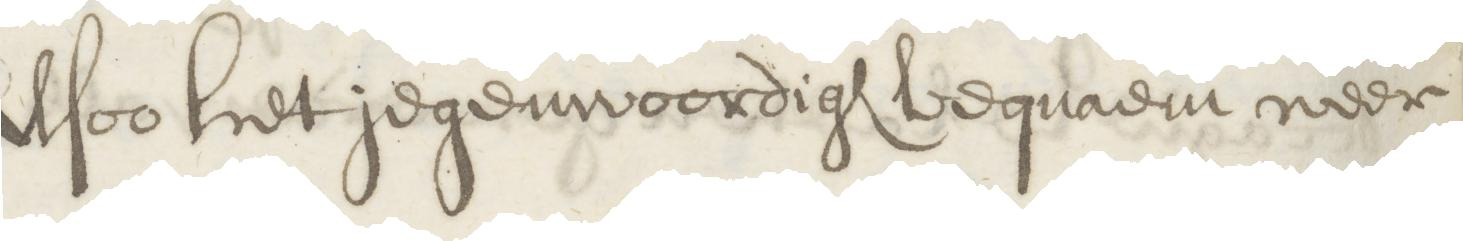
lsoo het jegenwoordigh bequaem weer
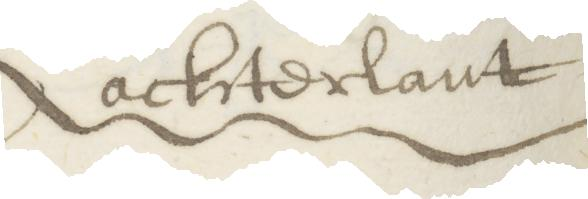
achterlant
